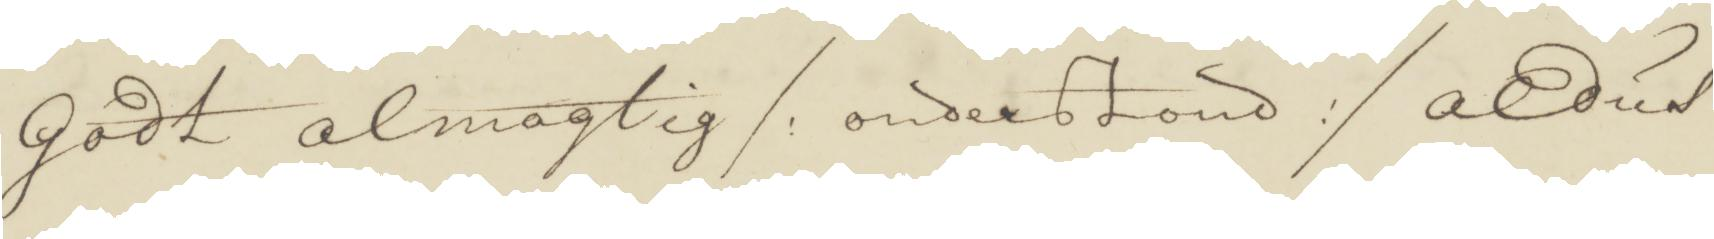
Godt almagtig /: onderstond :/ aldus
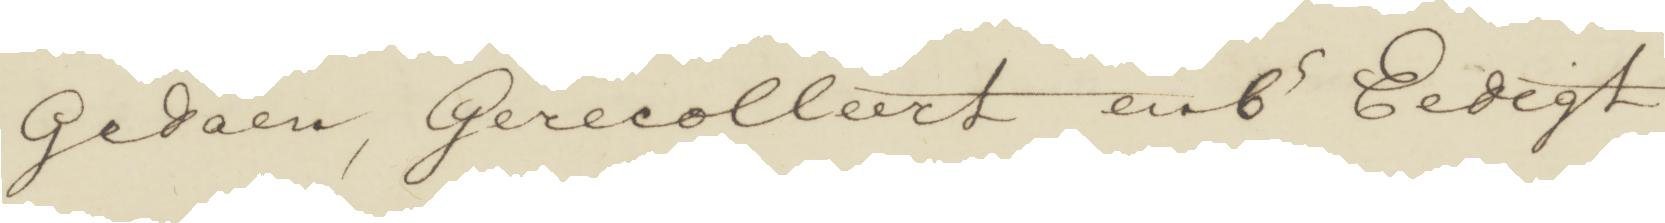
gedaen, Gerecolleert en b' Eedigt
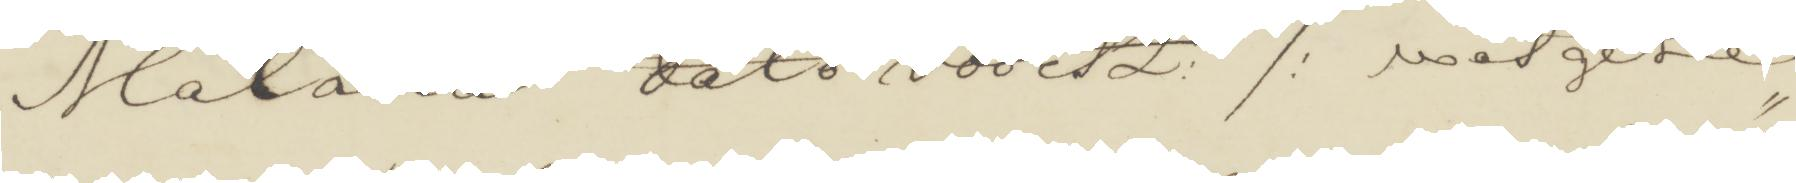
Malacca dato voorsz: /: was getee„
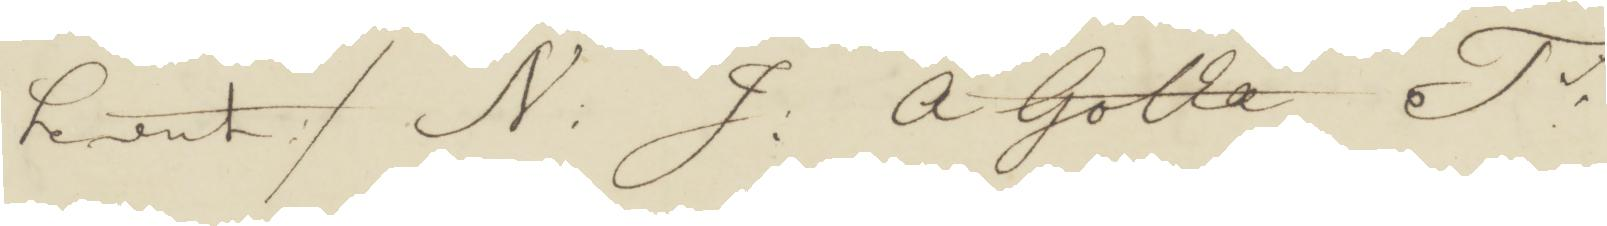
kent:/ N: J: â Gotta T:s
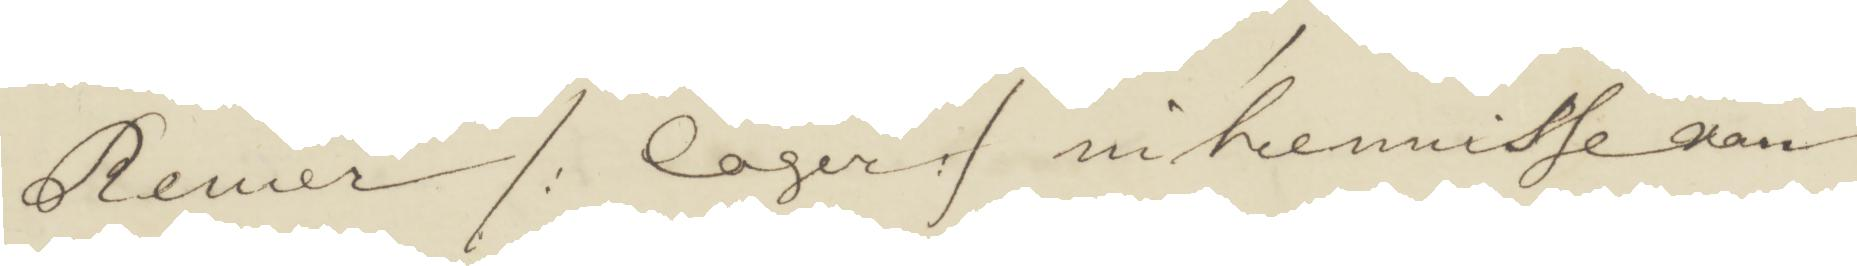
Remer /: lager :/ in kennisse van
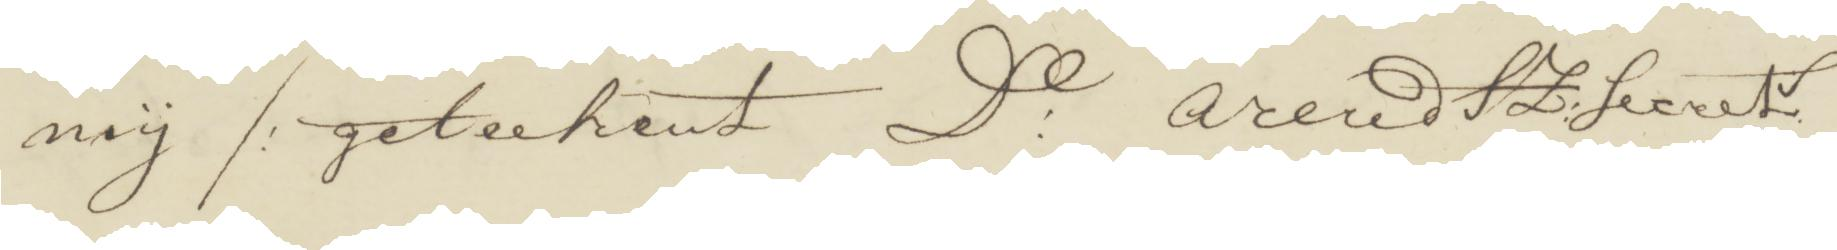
mij /: geteekent D:l Arendsz: Secret:s
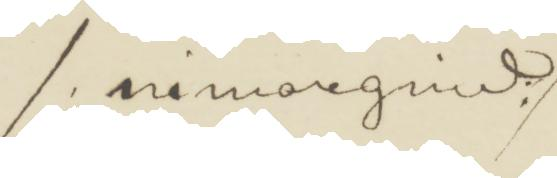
/. in margine:/
